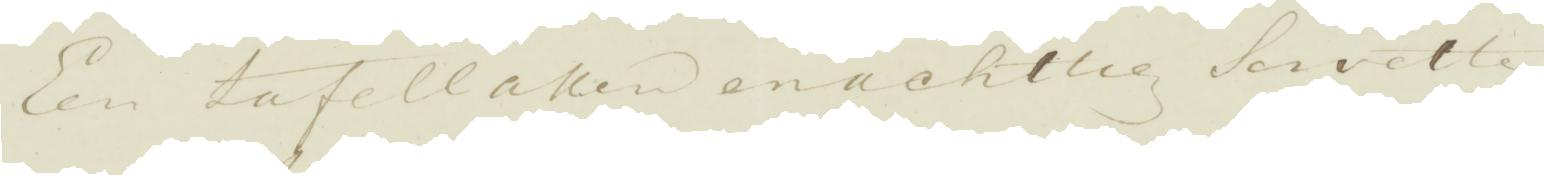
Een tafellaken en achttien servetten
